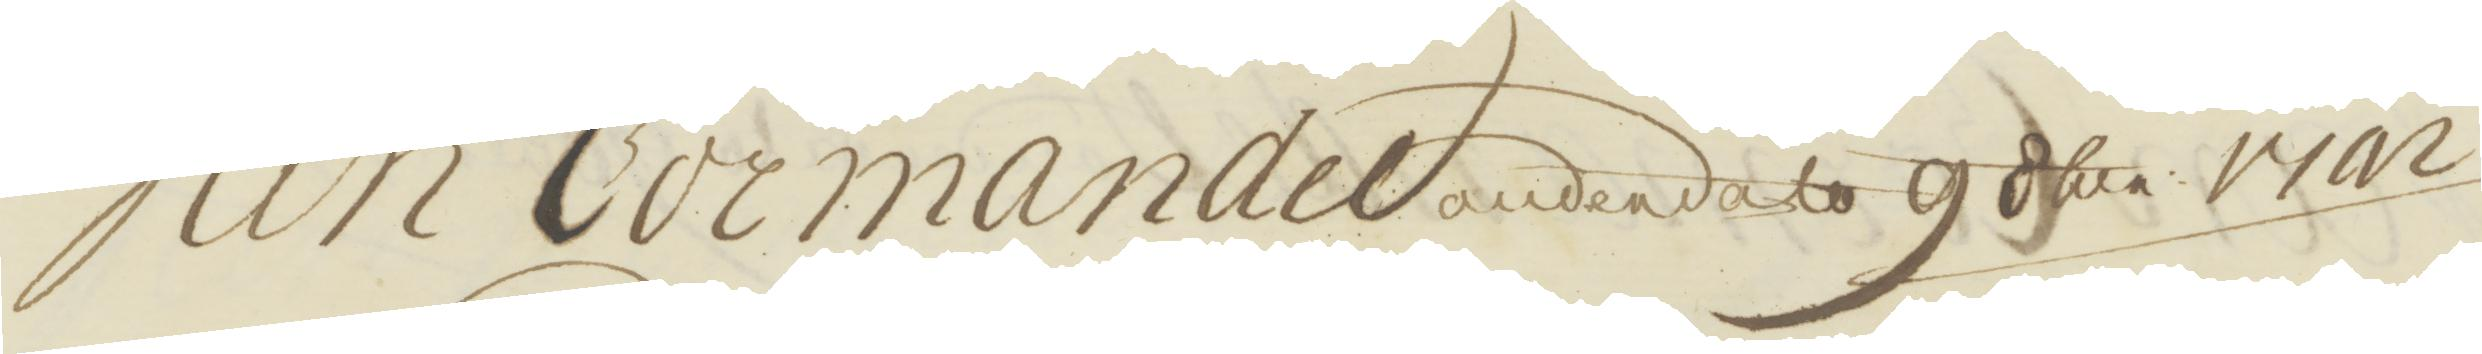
Van Cormandel onder dato 9 8ber: 1742
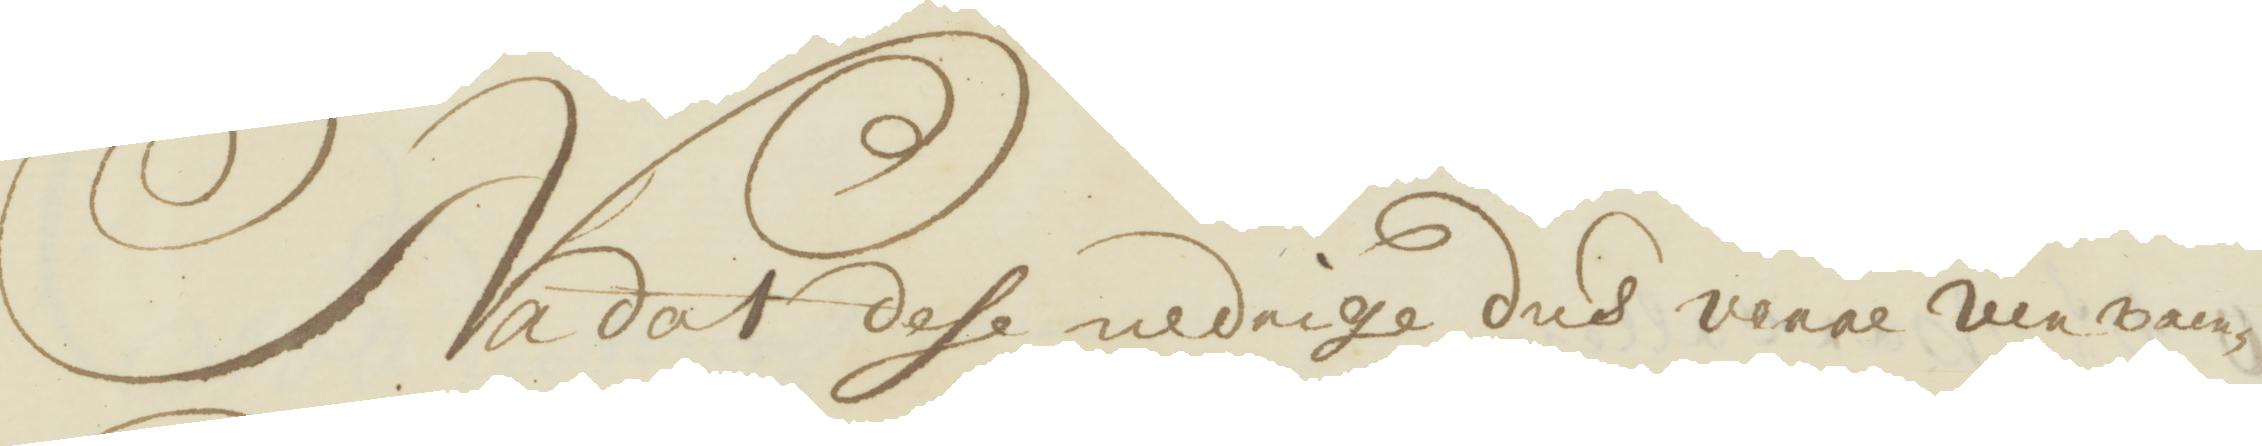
Na dat dese nedrige dus verre ver vaer
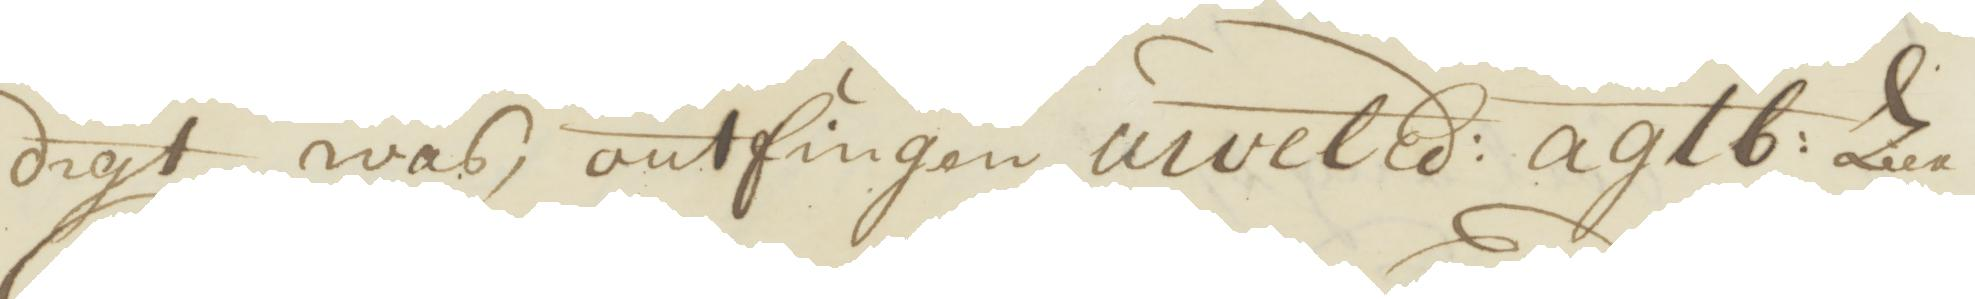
digt was, ontfingen uwel Ed: agtb: zeer
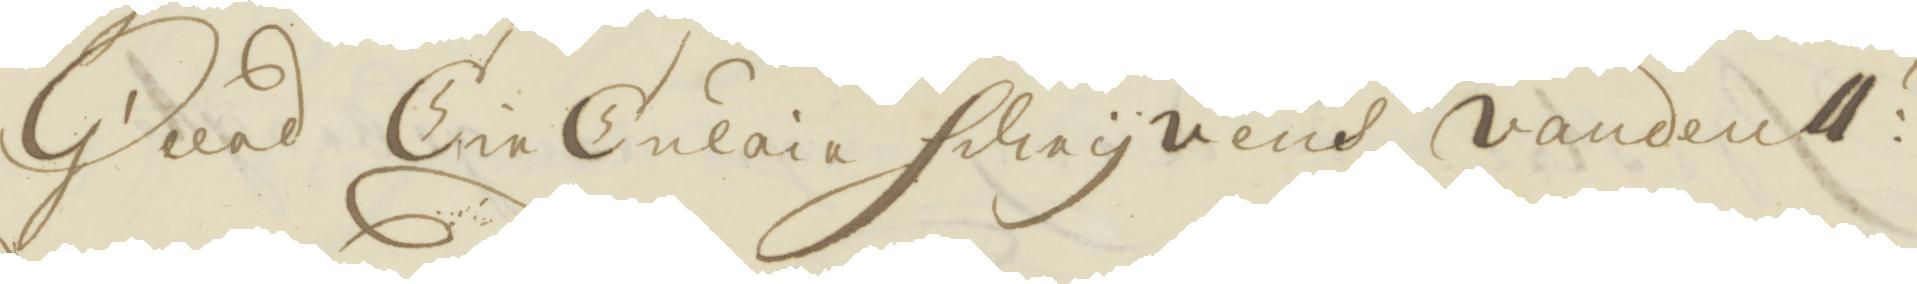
G'eerd CirCulair schrijvens vanden 4:'
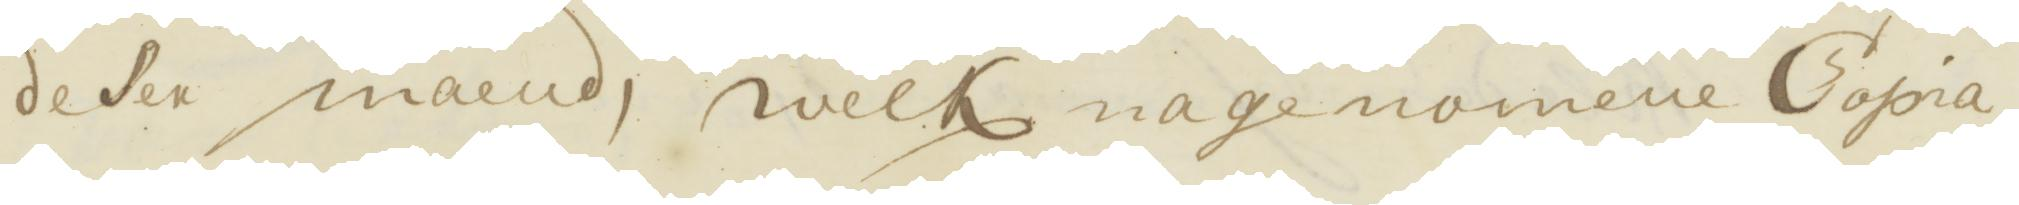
deser maend, welk nagenomene Copia,
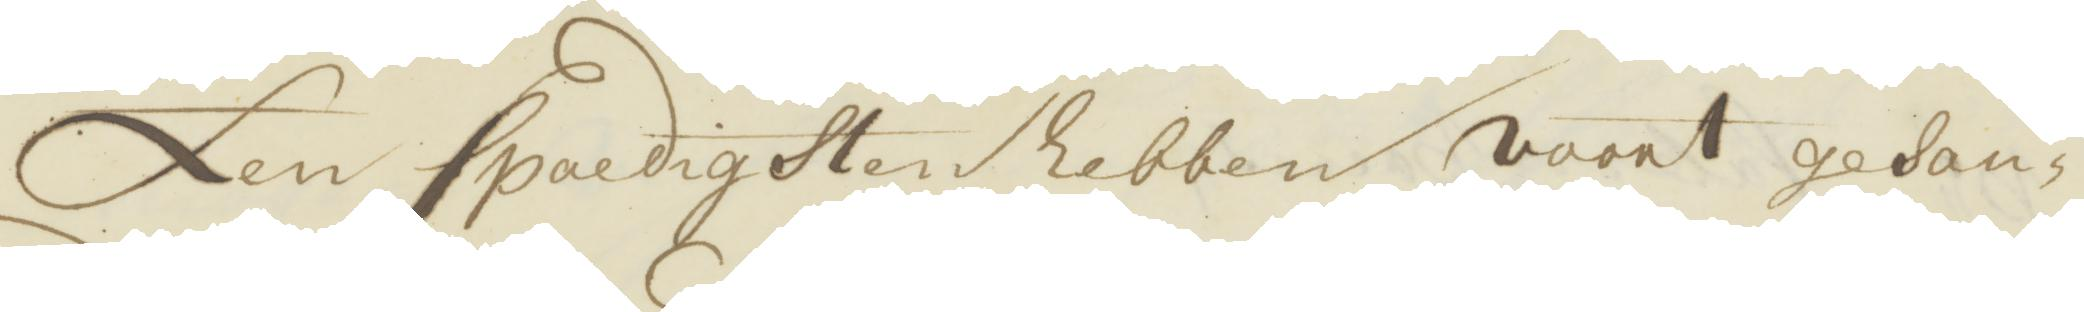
ten spoedigsten hebben voort geson„
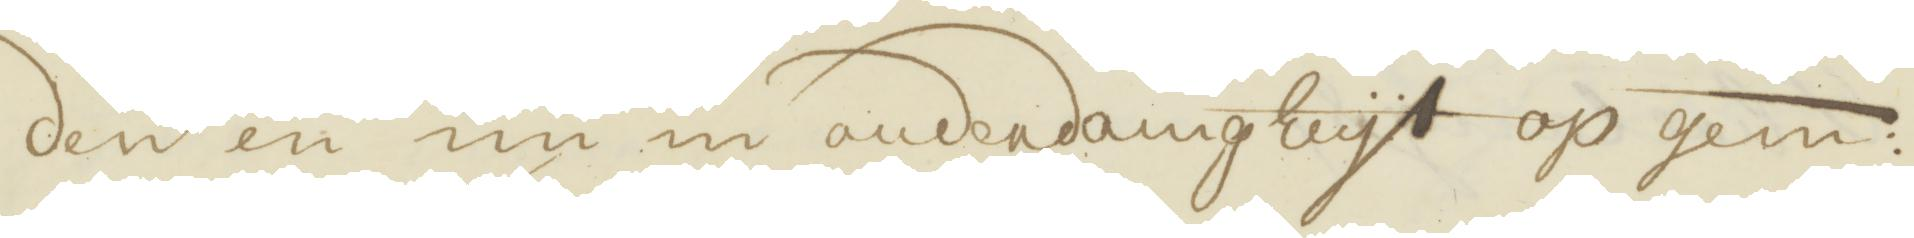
den en nu in onderdanigheijt op gem:
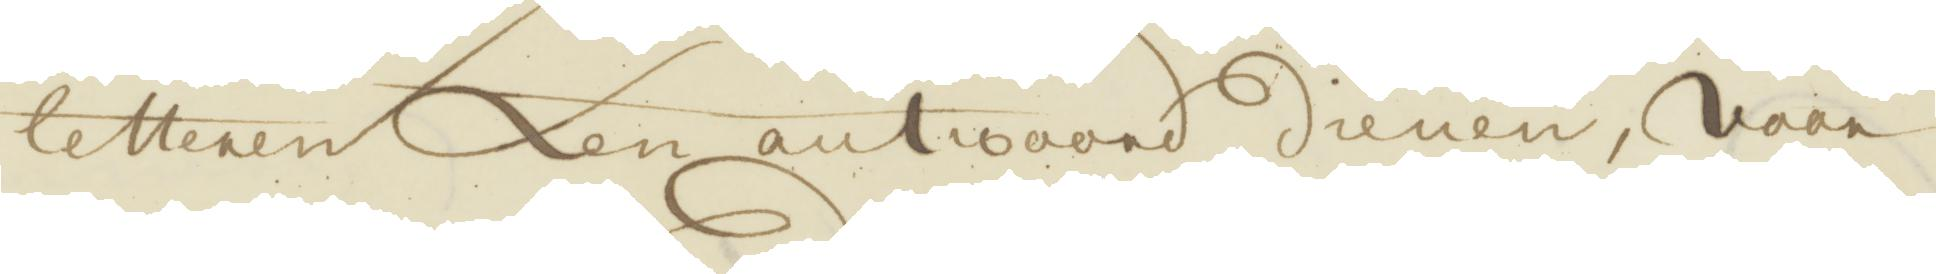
letteren ten antwoord dienen, voor
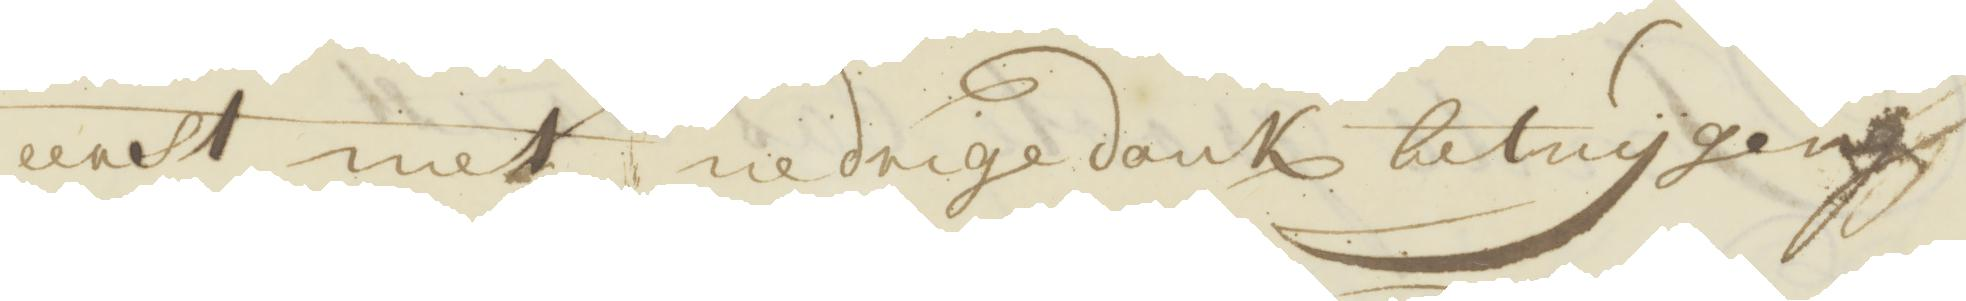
eerst met nedrige dank betuijgeing
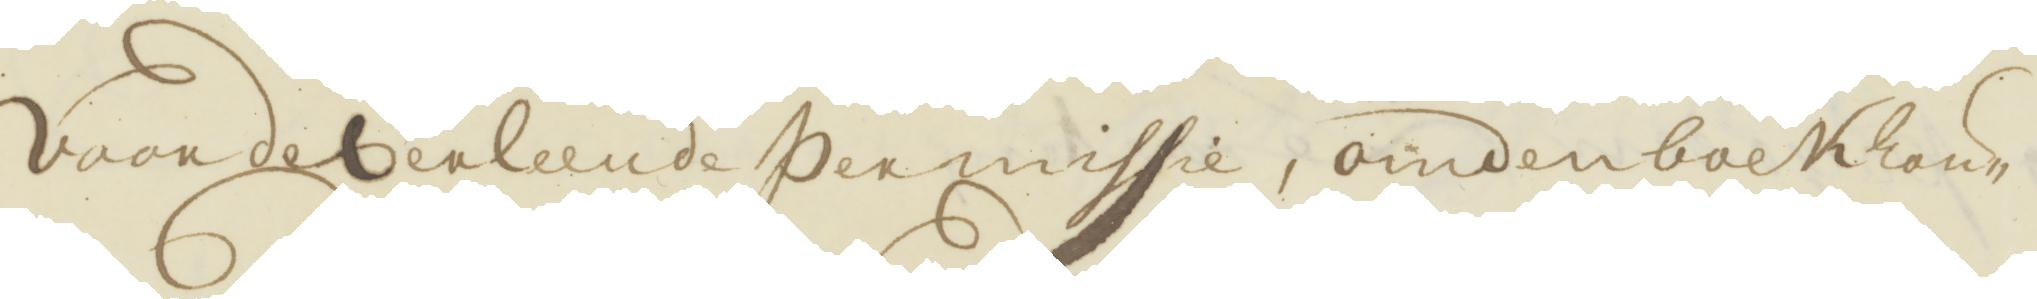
voor de verleende permissie, om den boekhou„
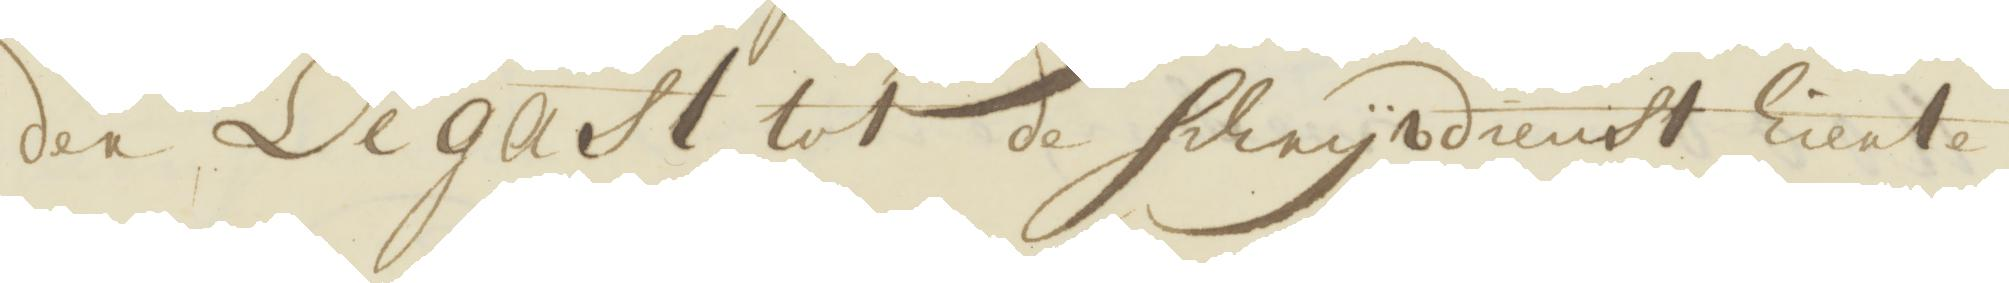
der De gast tot de schrijvdienst hier te
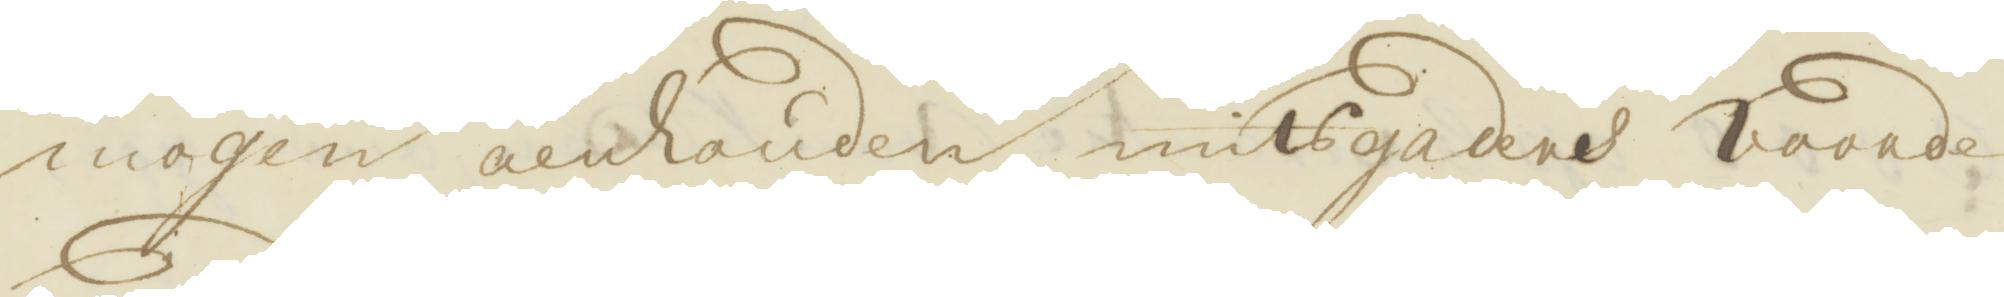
mogen aenhouden, mitsgaders voorde
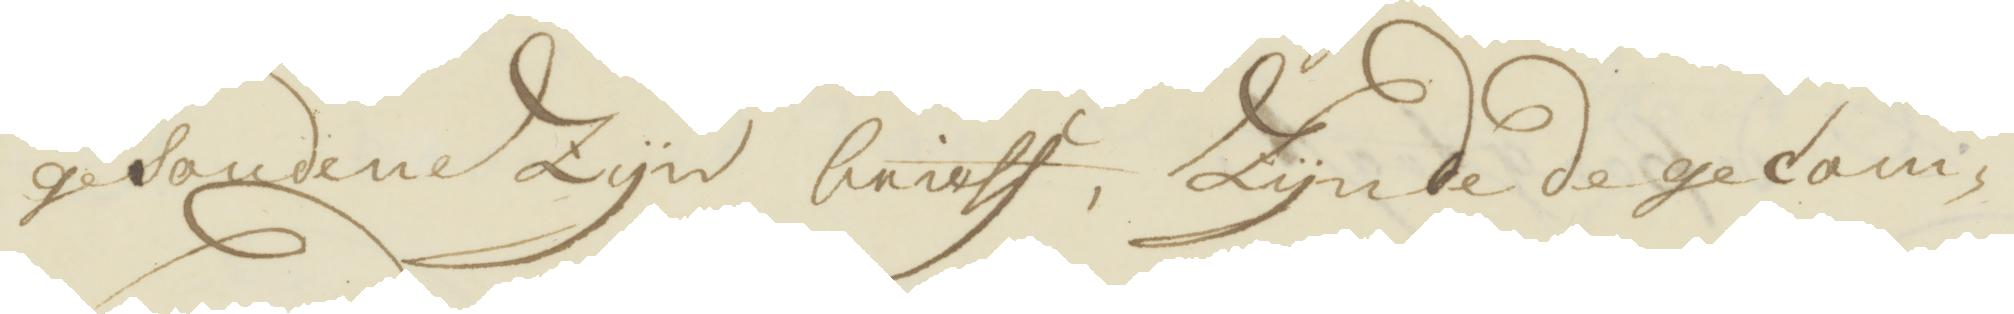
gesondene zijn brieff, zijnde de gecom„
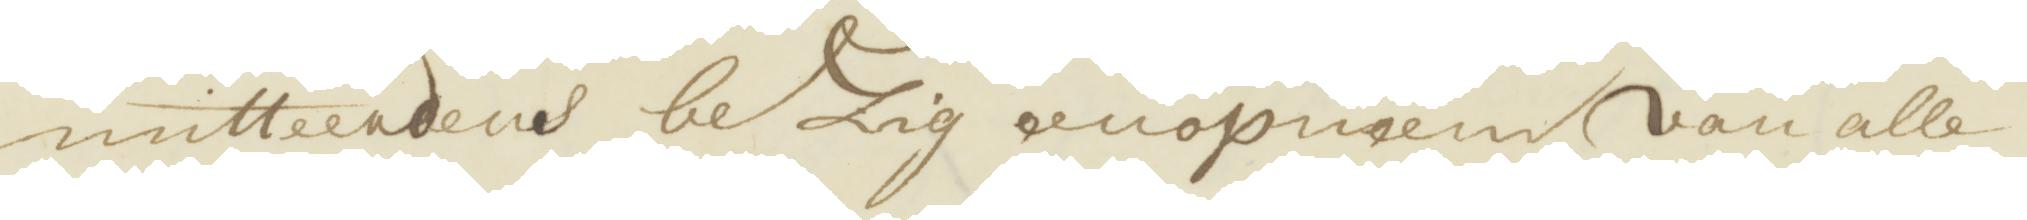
mitteerdens bezig een opneem van alle
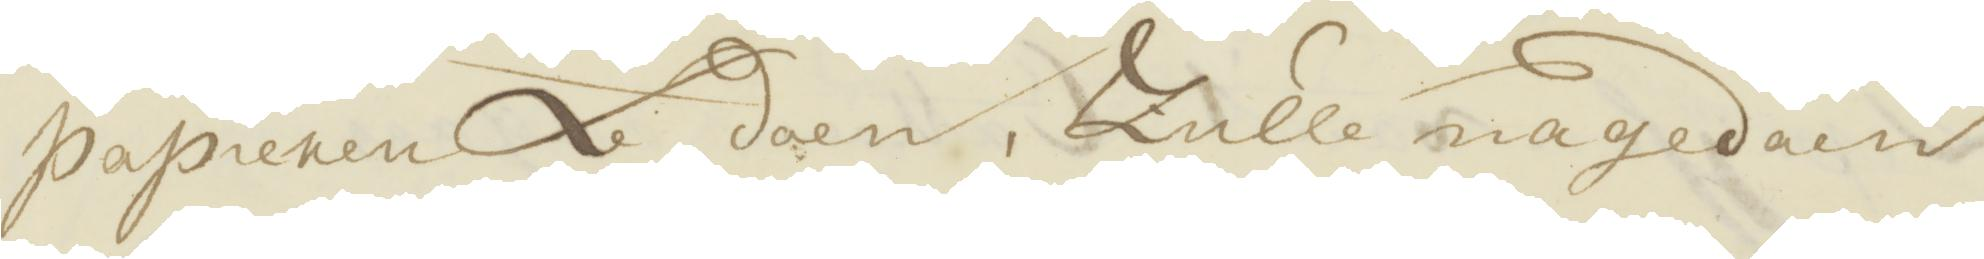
papieren te doen, zulle nagedaen
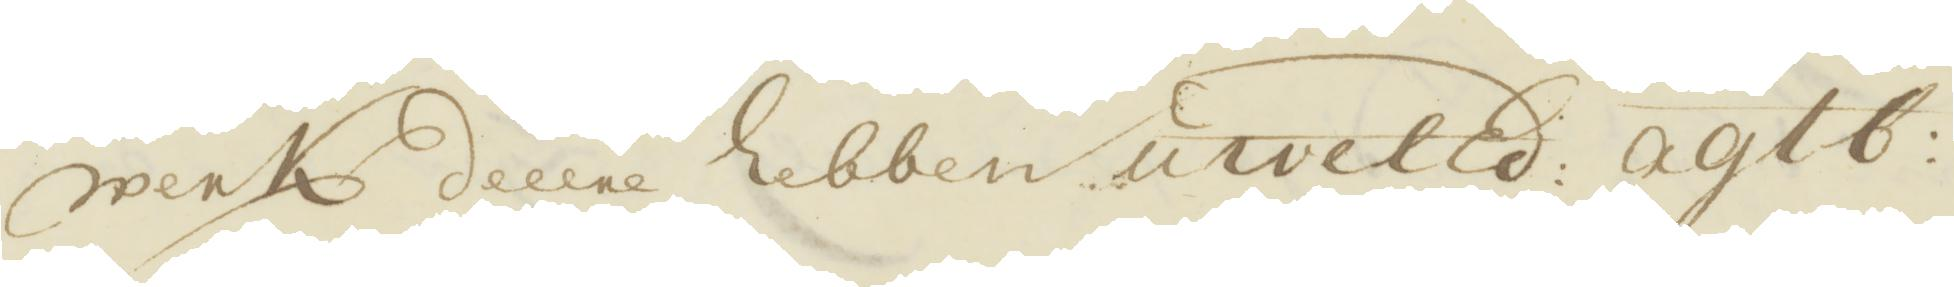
werk deeere hebben uwel Ed: agtb:
